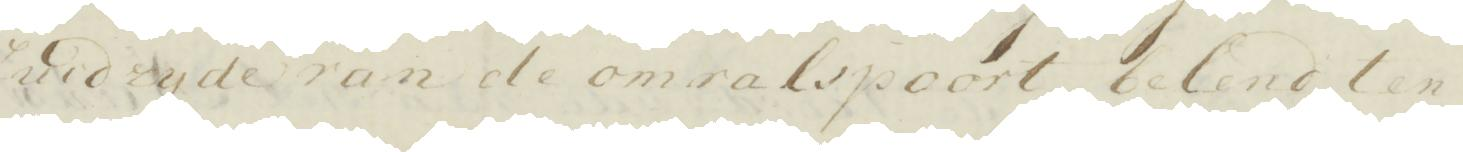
zuidzyde van de omvalspoort belend ten
